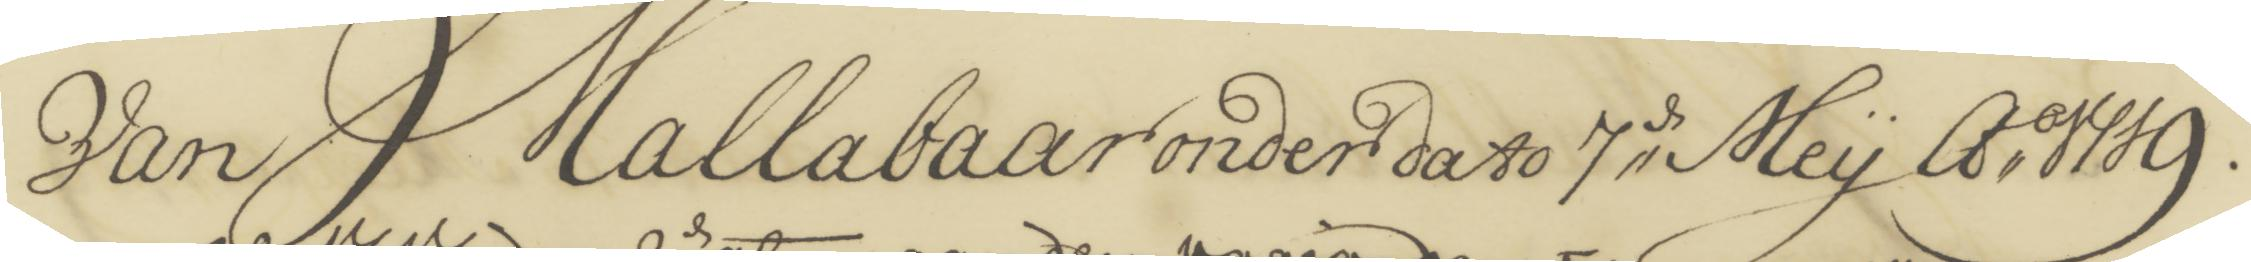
Van Mallabaar onder dato 7„en Meij A„o 1719.
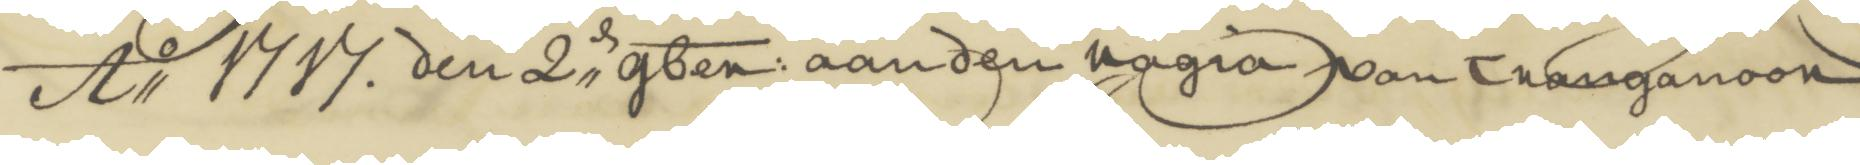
A„o 1717. den 2„en 9ber: aan den ragia van Cranganoor
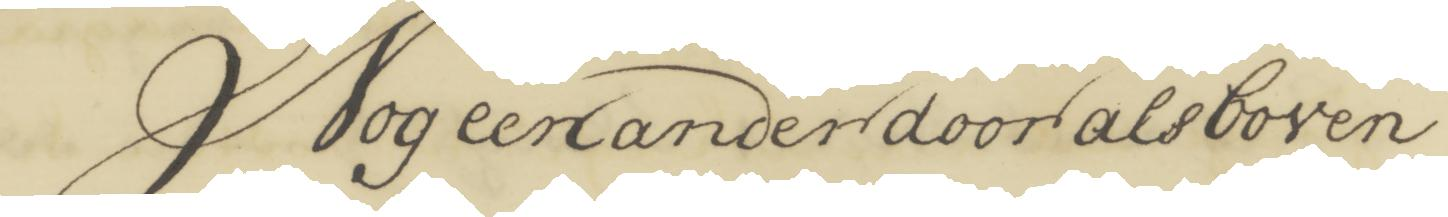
Nog een ander door als boven
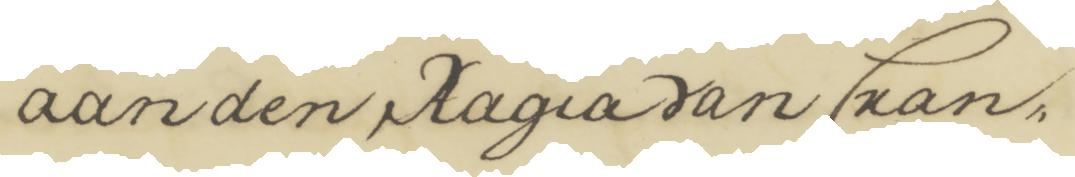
aan den Ragia van Cran„
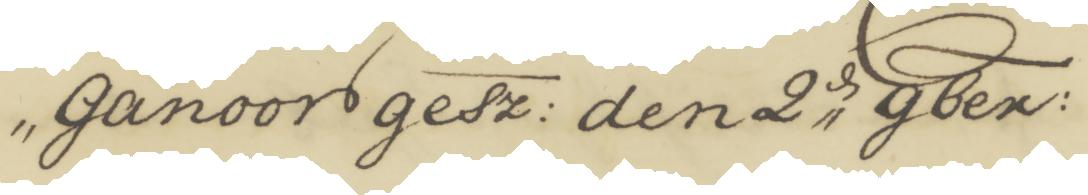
„ganoor gesz: den 2„en 9ber:
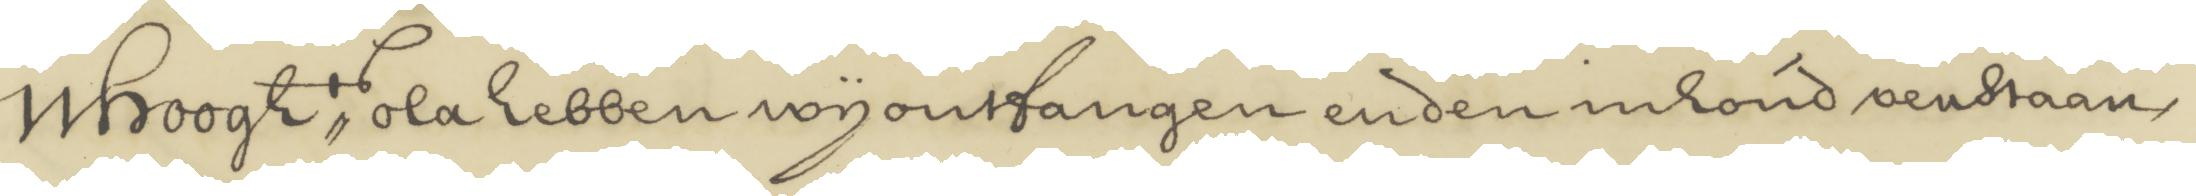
UHoogh„ts ola hebben wij ontfangen enden inhoud verstaan,
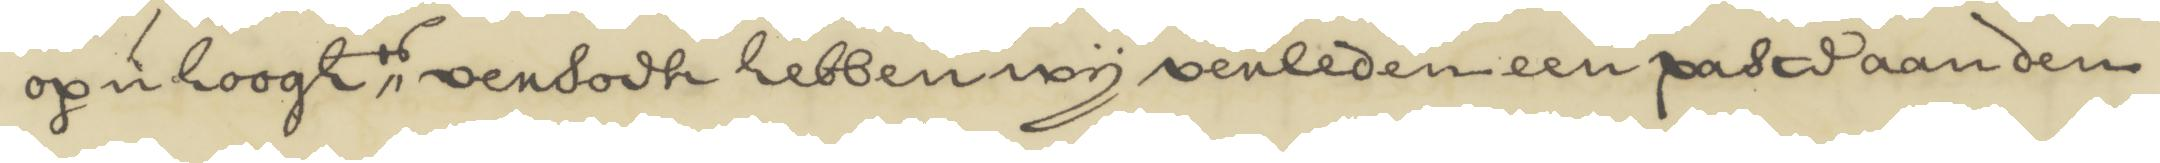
op u hoogh„ts versoek hebben wij verleden een pasce aan den
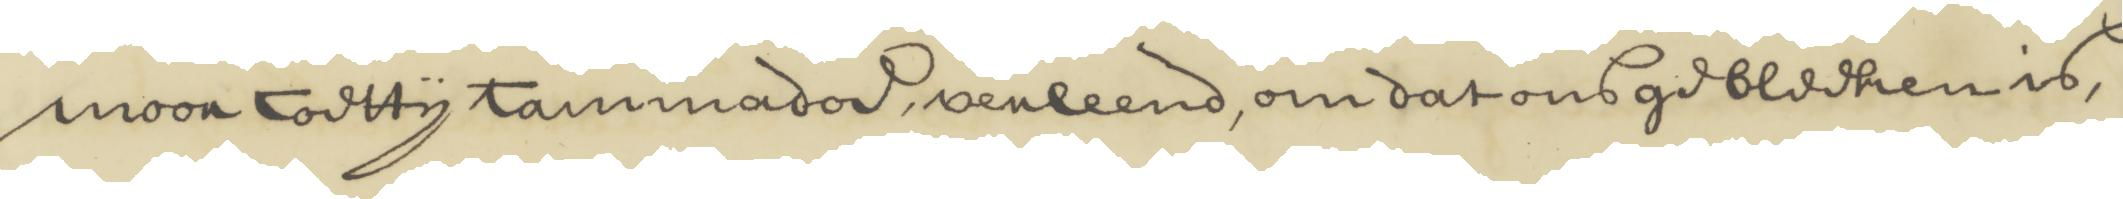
moor coettij cammadoe, verleend, om dat ons gebleeken is,
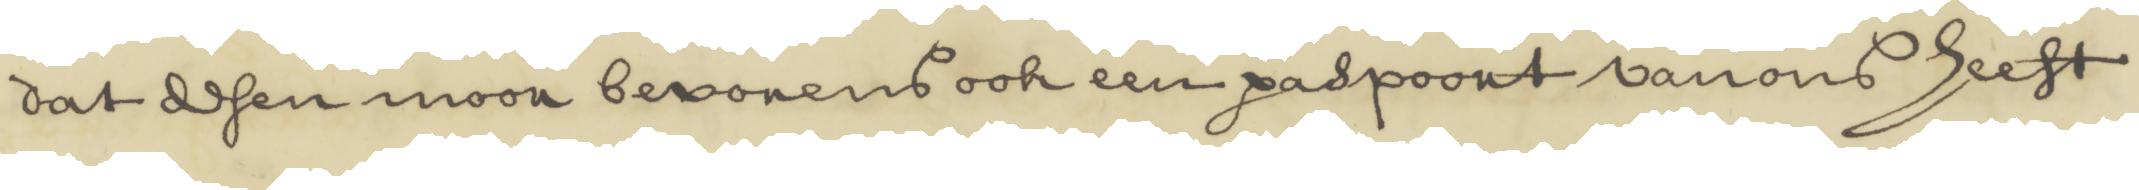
dat desen moor bevorens ook een paspoort van ons heeft
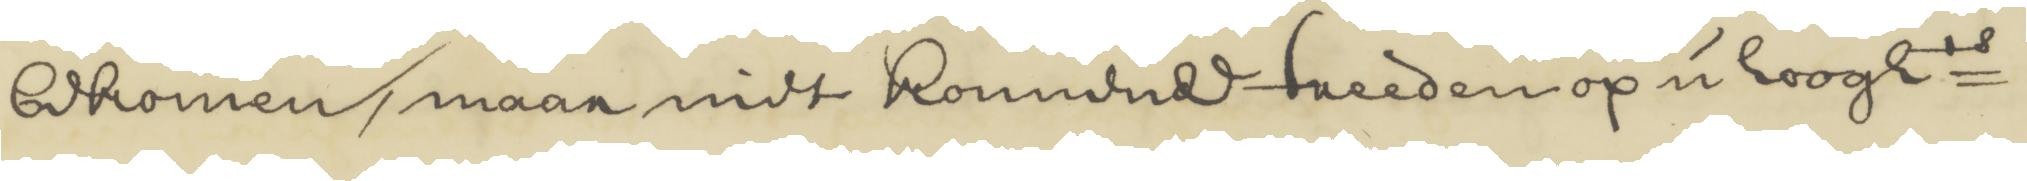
bekomen, maar niet konnende treeden op u hoogh=ts
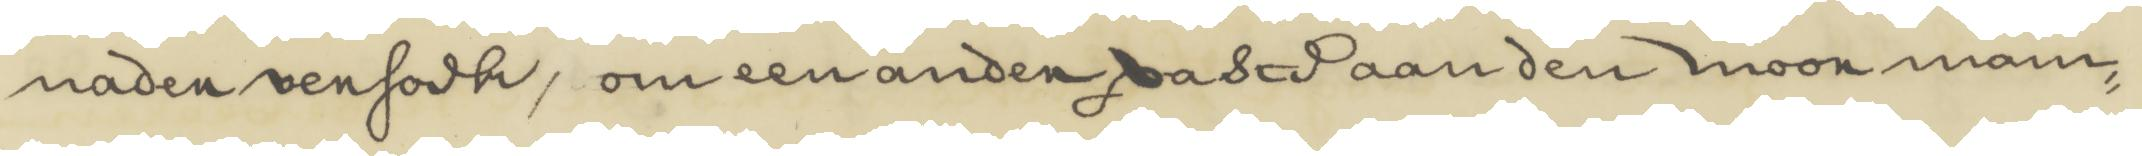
nader versoek, om een ander pasce aan den moor mam„
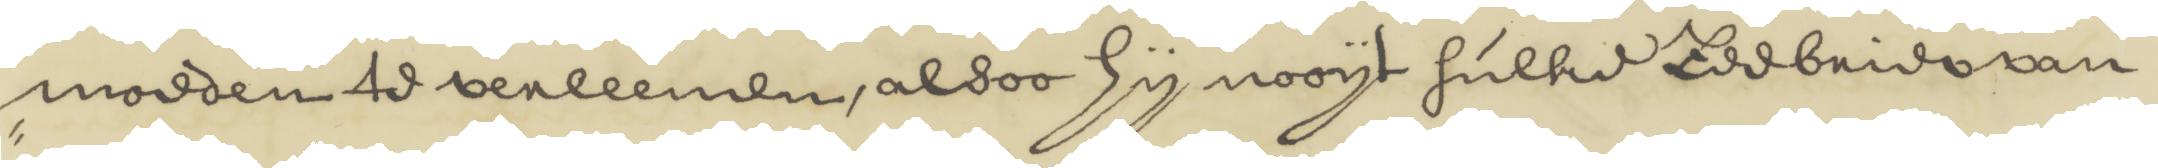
„moeden te verleenen, alsoo hij nooijt sulke zeebriev van
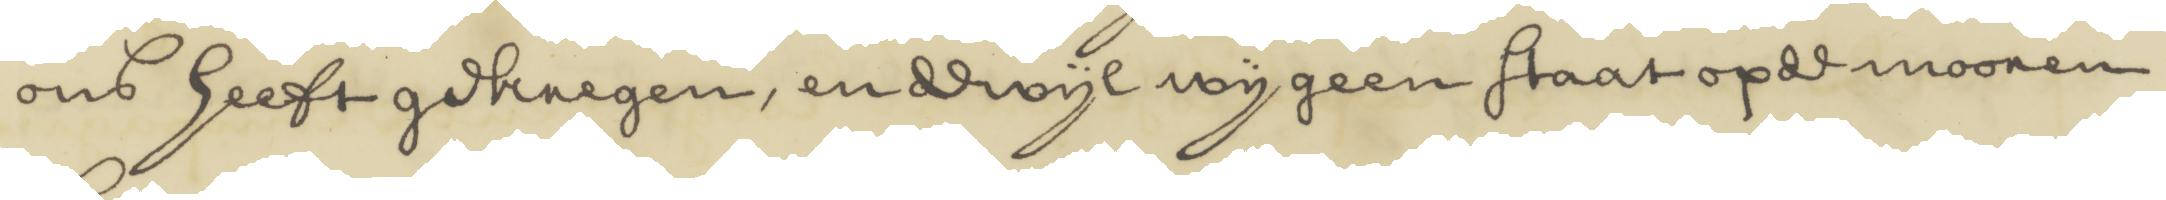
ons heeft gekregen, en dewijl wij geen staat op de mooren
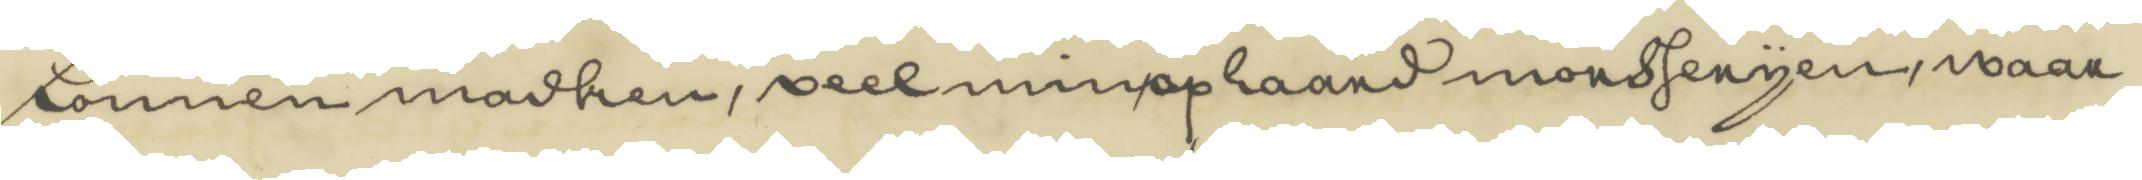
konnen maeken, veel min,op haare morsserijen, waar
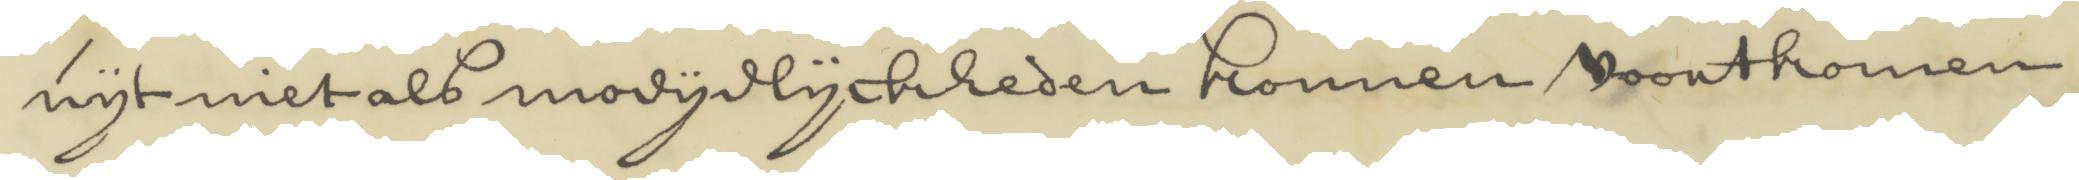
uijt niet als moeijelijckheden konnen voortkomen
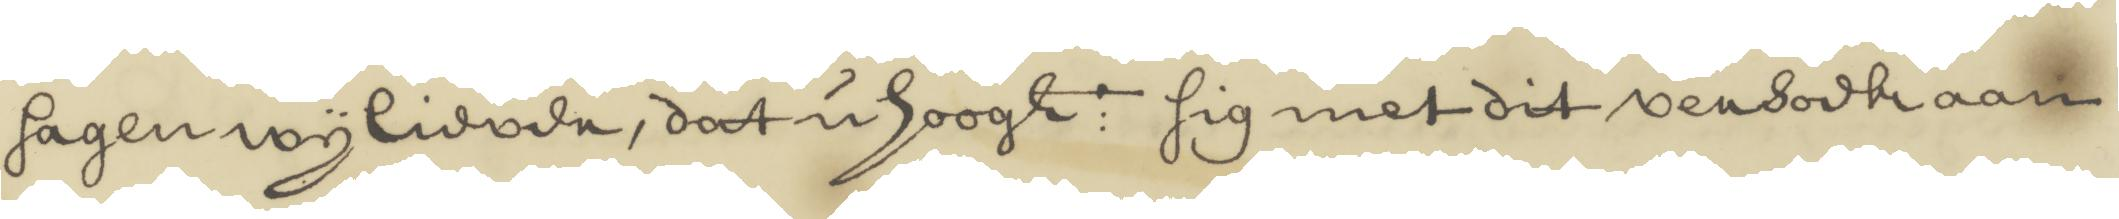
sagen wij liever, dat u hoogh:t sig met dit versoek aan
